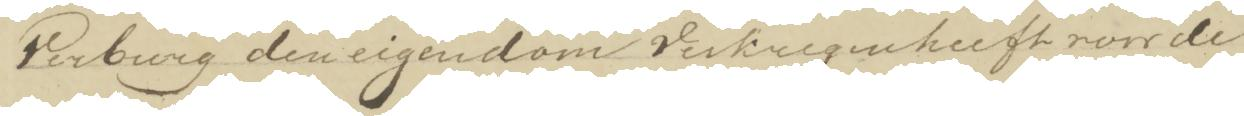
Verburg den eigendom Verkregen heeft voor de
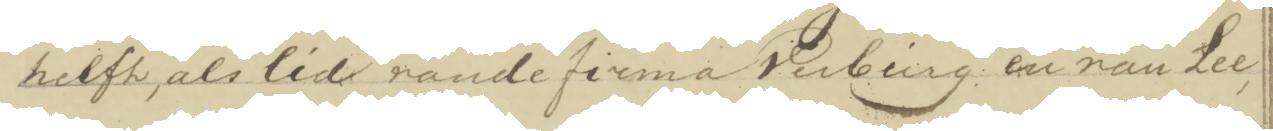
helft, als lid van de firma Verburg en van Lee„
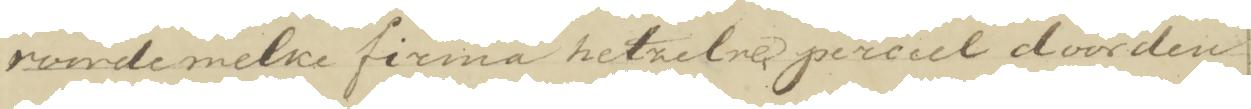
voor de welke firma hetzelve perceel door den
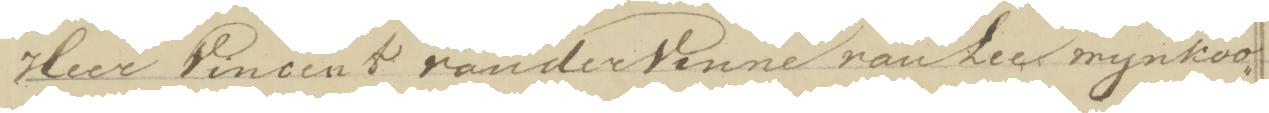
Heer Vincent van der Vinne van Lee wynkoo
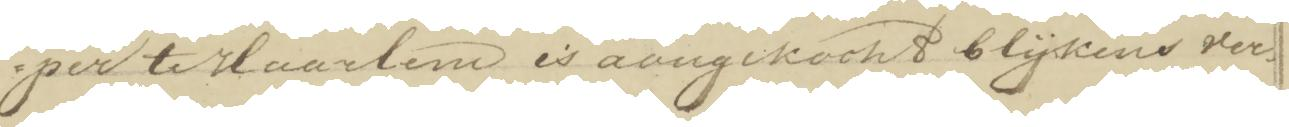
„per te Haarlem is aangekocht blijkens ver
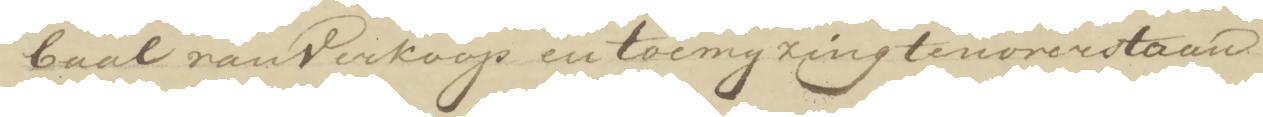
baal van Verkoop en toewyzing ten overstaan
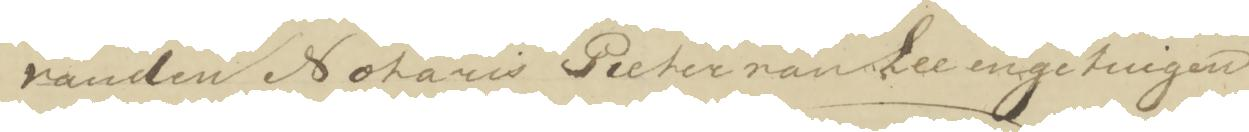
van den Notaris Pieter van Lee en getuigen
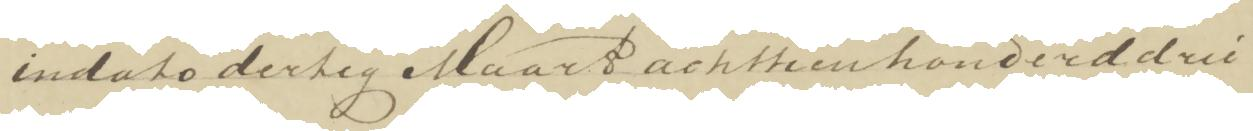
in dato dertig Maart achttienhonderd drie
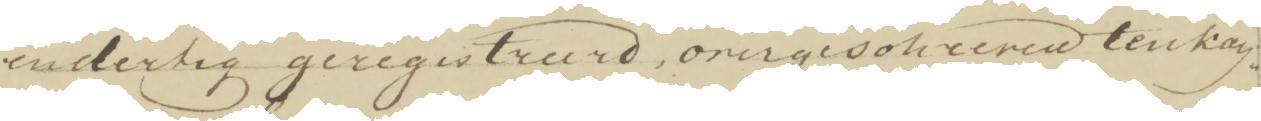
en dertig geregistreerd, overgeschreven ten kan„
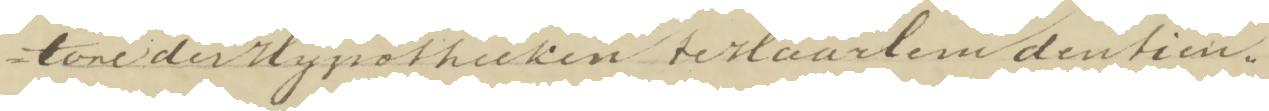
=tore der Hypotheeken te Haarlem den tien„
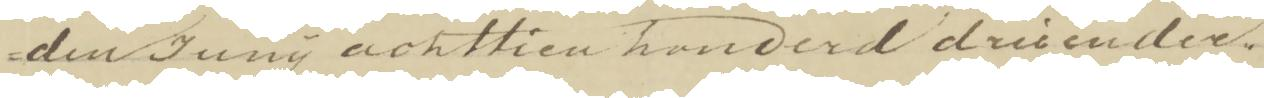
„den Iunij achttien honderd drie en der„
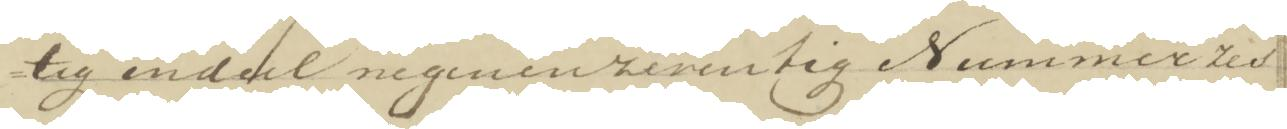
=tig in deel negen en zeventig Nummer zes
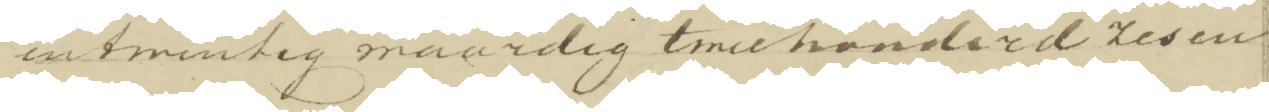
en twintig waardig twee honderd zes en
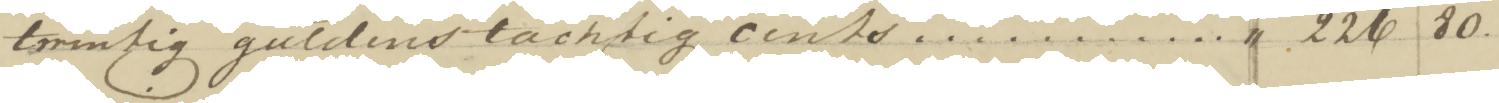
twintig guldens tachtig cents . . . . . . . . . . . „ 226 80.
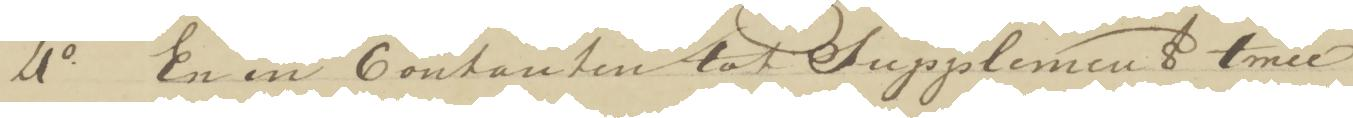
4.o En in Contanten tot Supplement twee
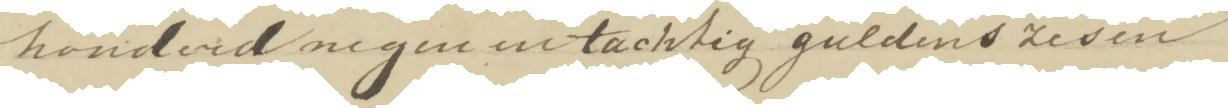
honderd negen in tachtig guldens zes en
